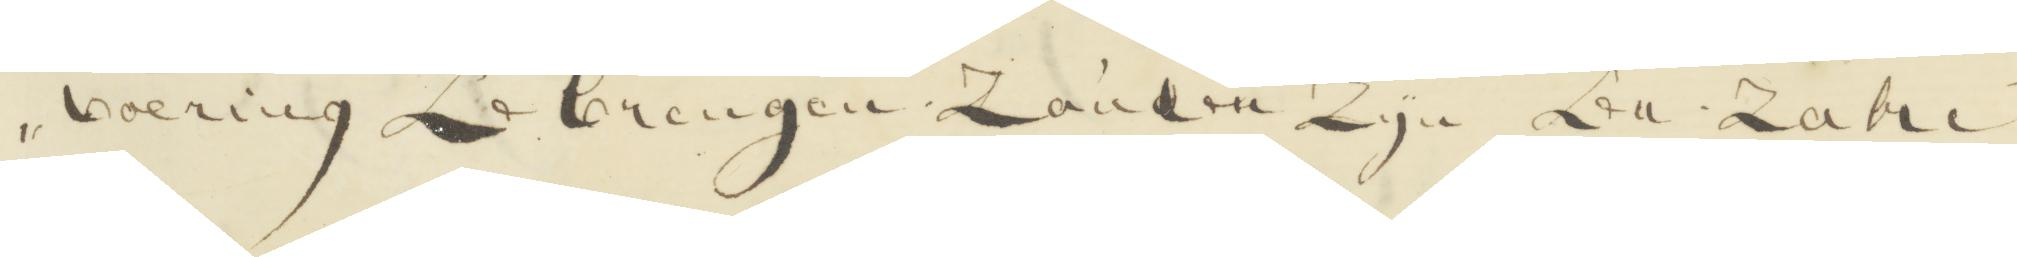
„voering te brengen zouden zijn ter zake
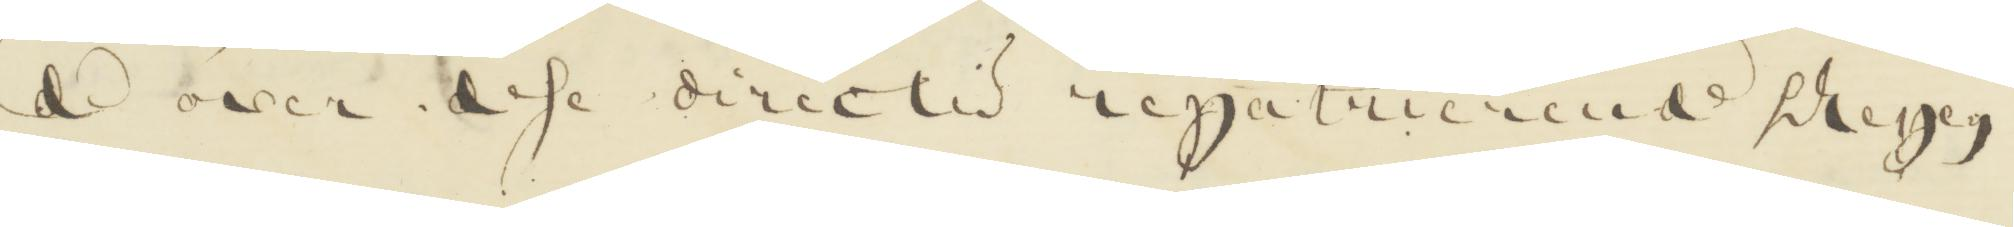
(de over dese directie repatrierende schepen
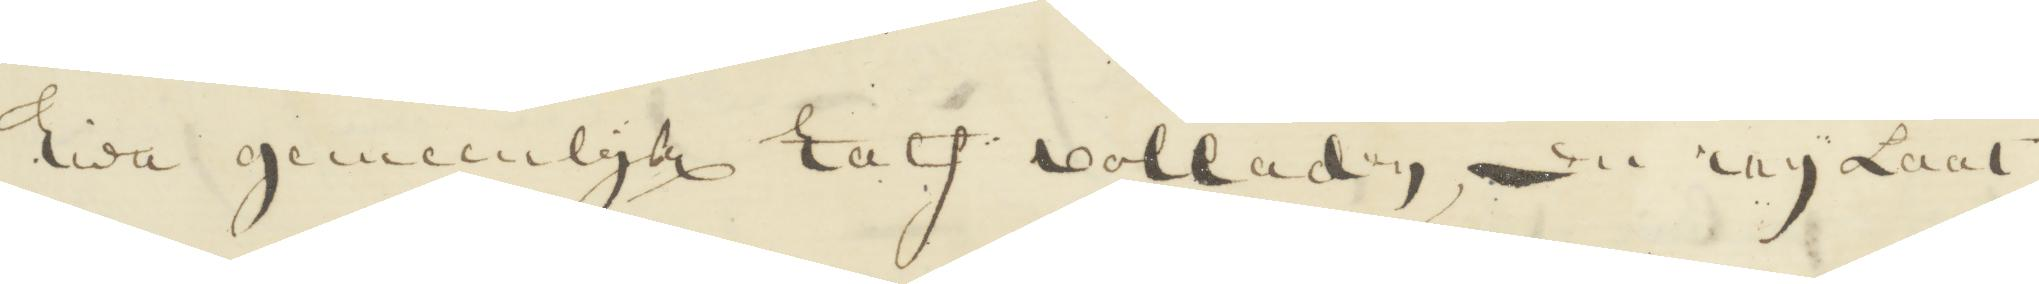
hier gemeenlijk half volladen, en raij laat
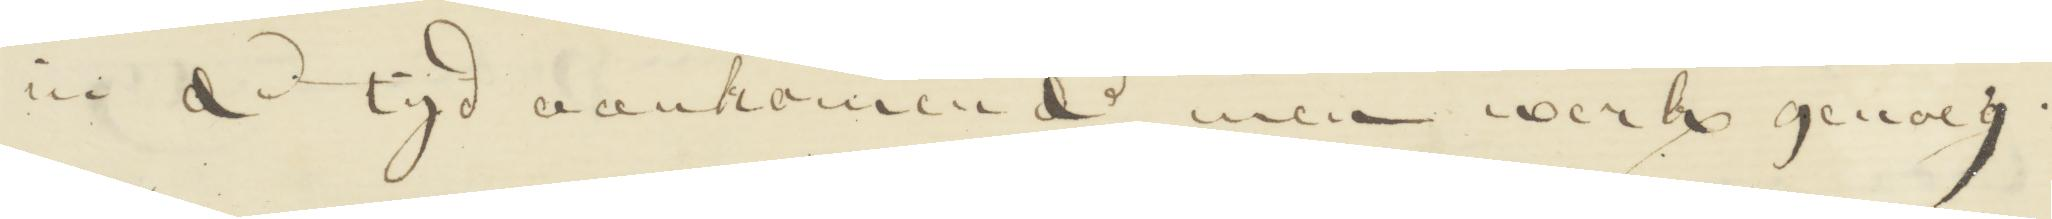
in de tijd aankomende men werk genoeg
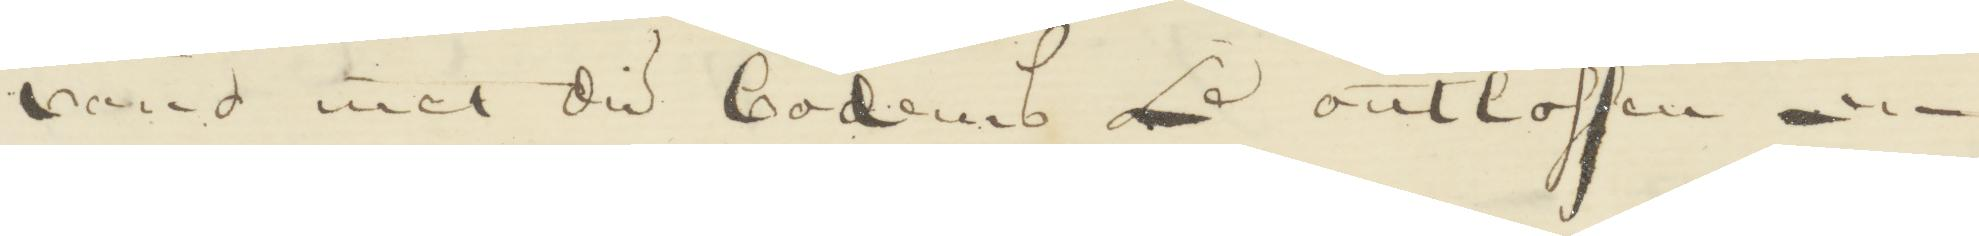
vond met die bodems te ontlossen en
